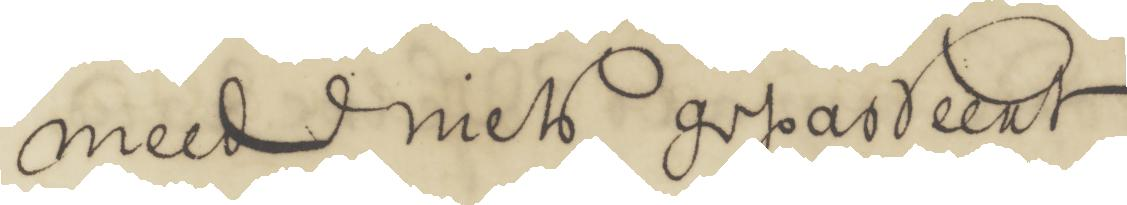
meede niets gepasseert
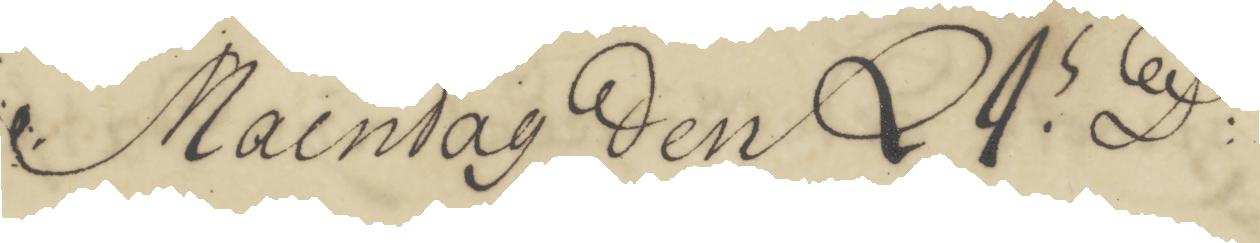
Maendag den 24:' D:o
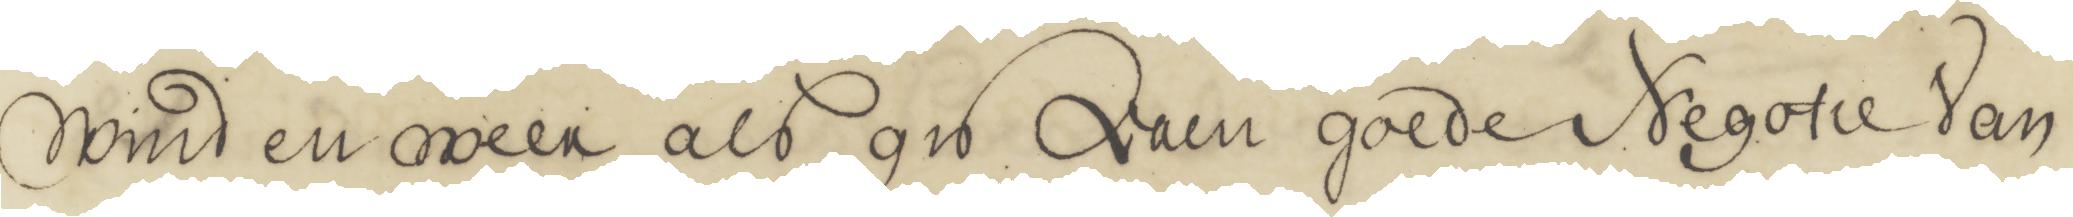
wind en weer als gistren goede Negotie van
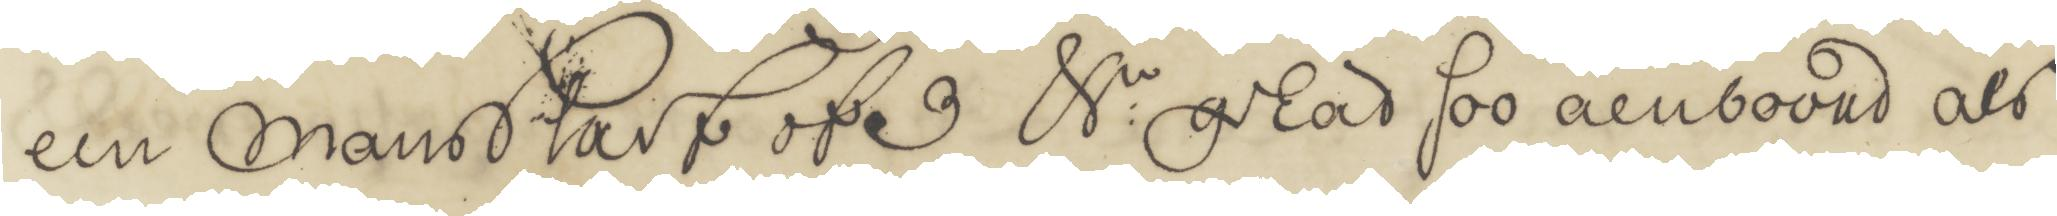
een mansslaef of 3 &:a gehad soo aenboord als
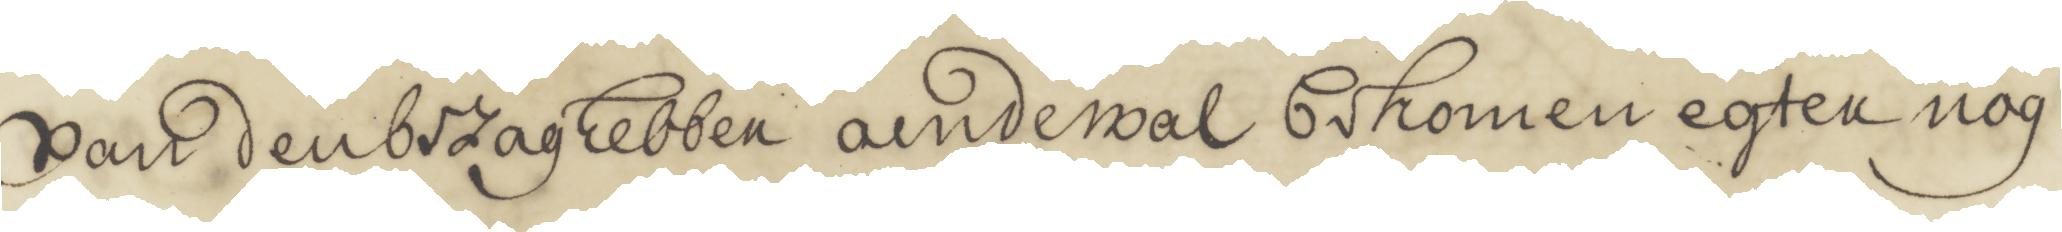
van den bezaghebber aendewal bekomen egter nog
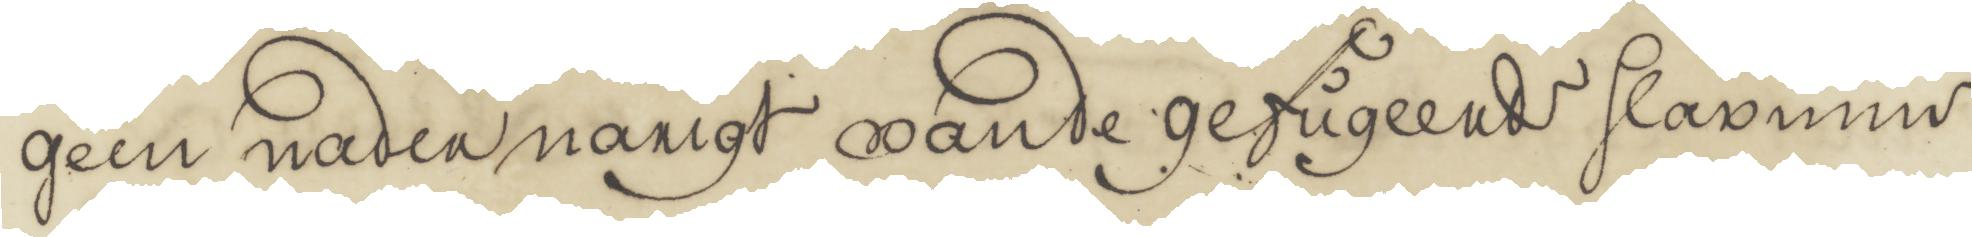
geen nader narigt van de gefugeerde slavinne
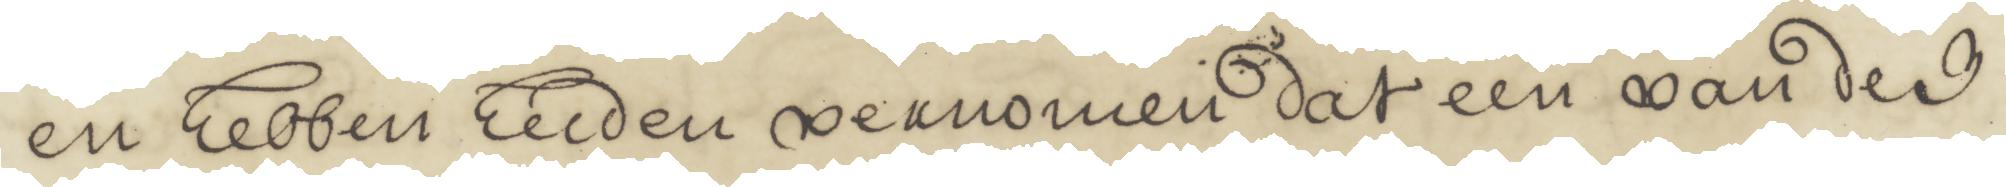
en hebben heeden vernomen dat een van de 3
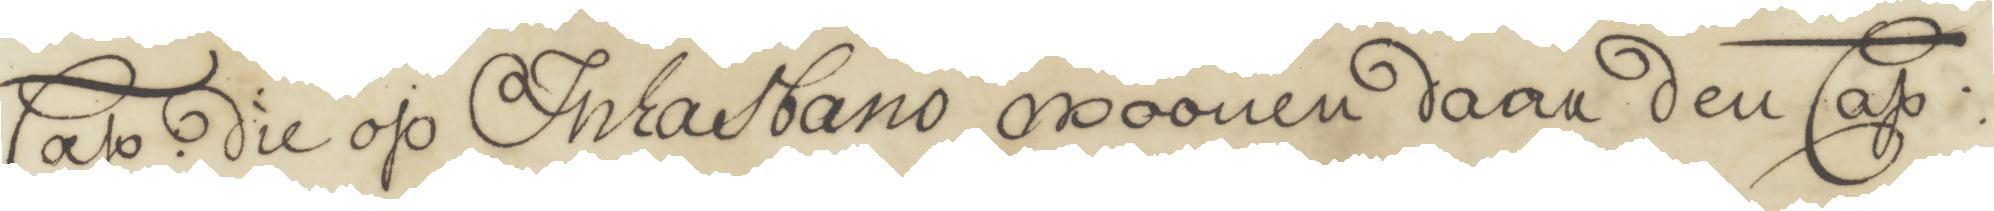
Cap. die op Inhasbano woonen daar den Cap:
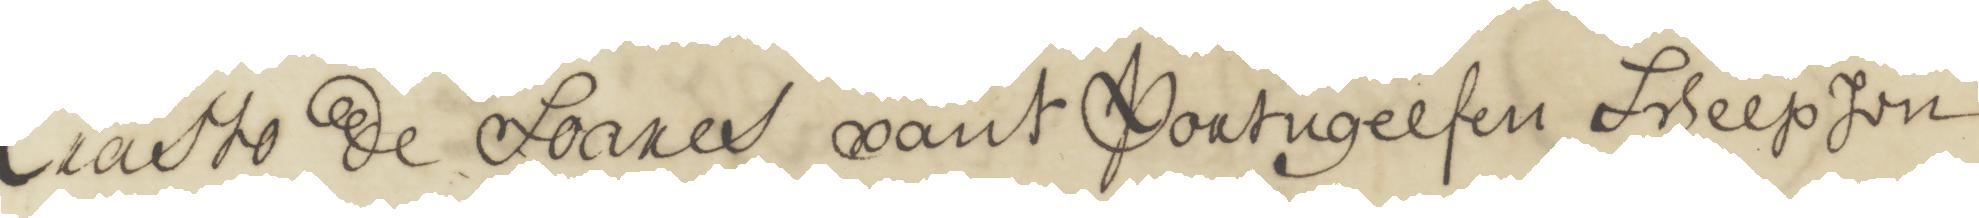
Crasto de soares van’t Portugeesen scheepjen
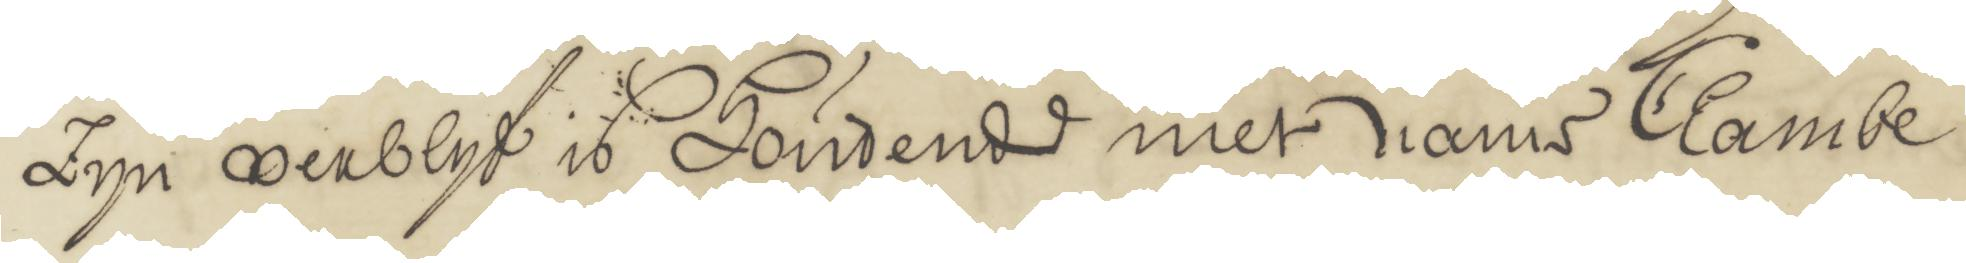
zyn verblyf is houdende met name Chambe
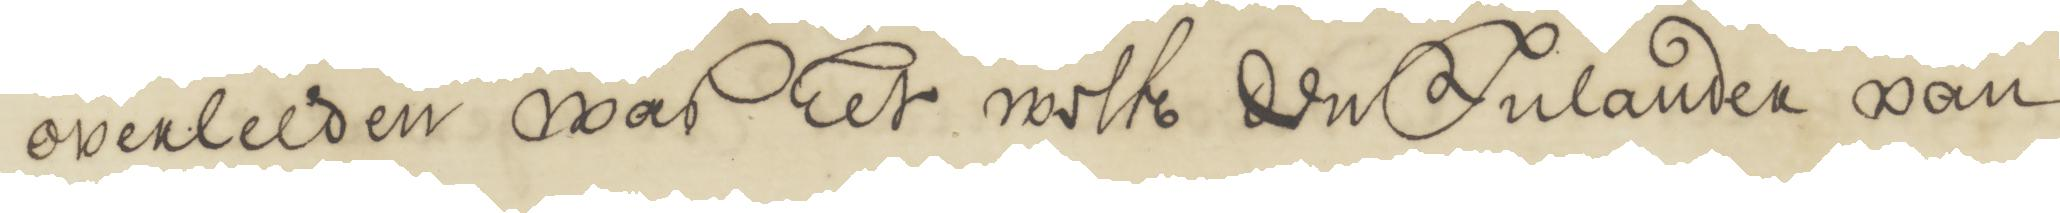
overleeden was het welk den Inlander van
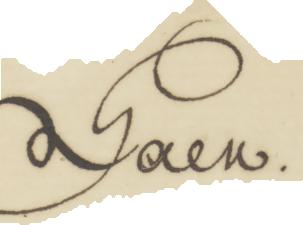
Haer
